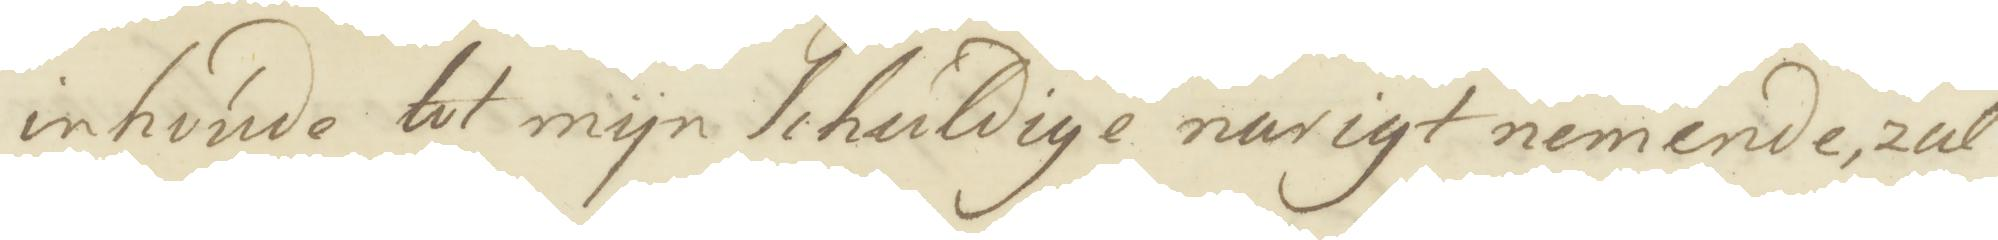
inhoude tot mijn schuldige narigt nemende, zal
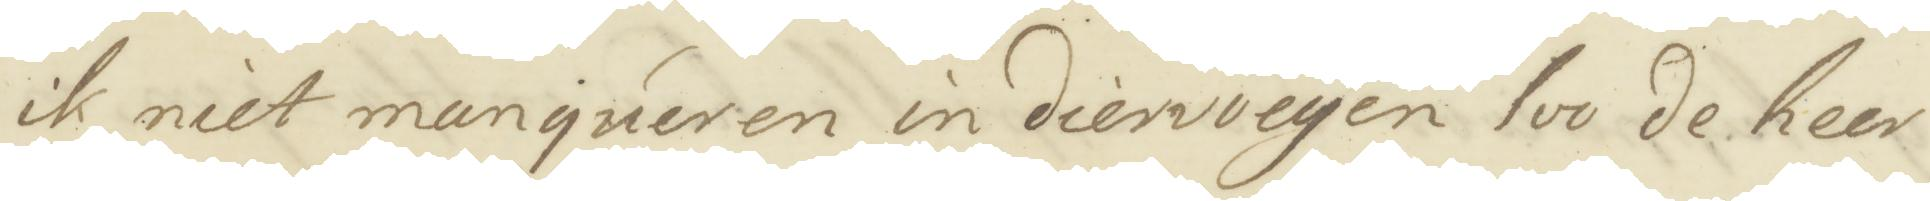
ik niet manqueren in diervoegen soo de heer
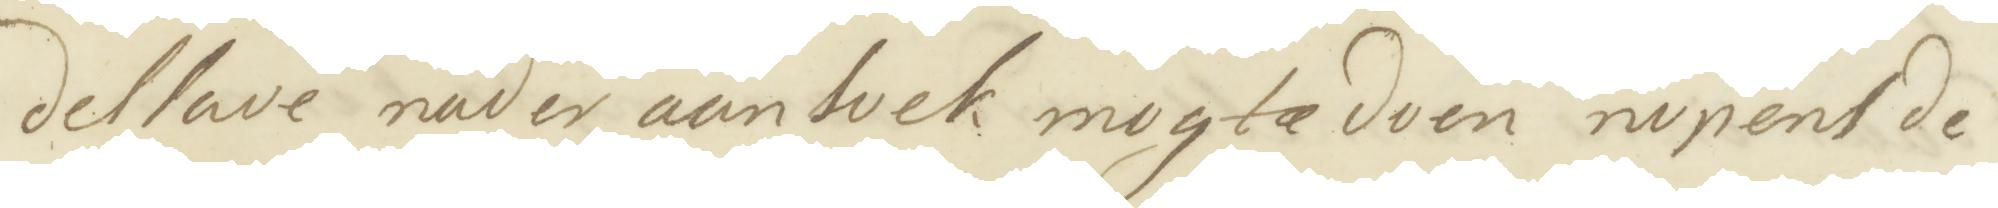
dessave nader aansoek mogte doen nopens de
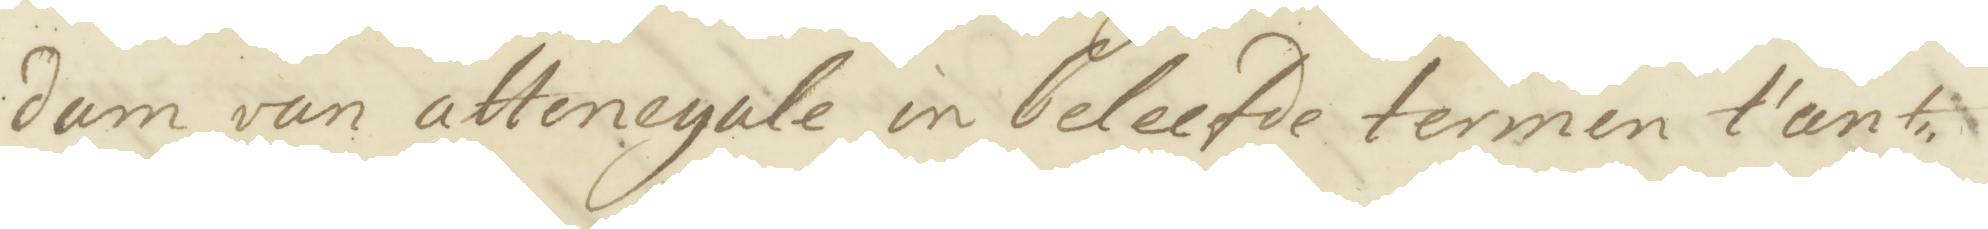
dam van attenegale in beleefde termen t'ant„
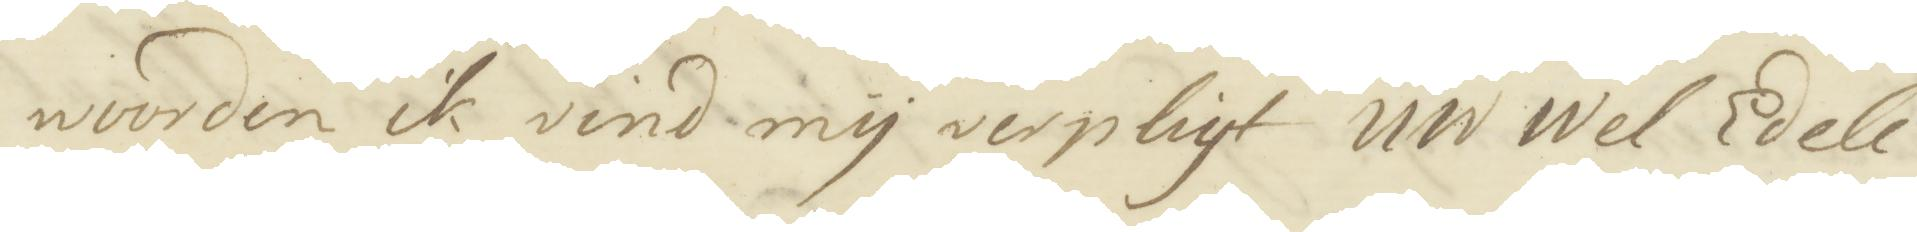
woorden ik vind mij verpligt uw wel Edele
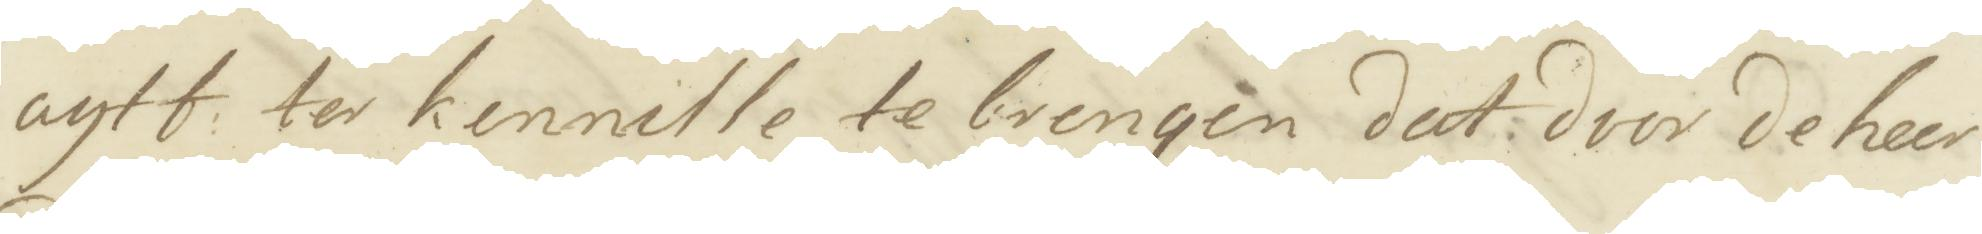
agtb: ter kennisse te brengen dat door de heer
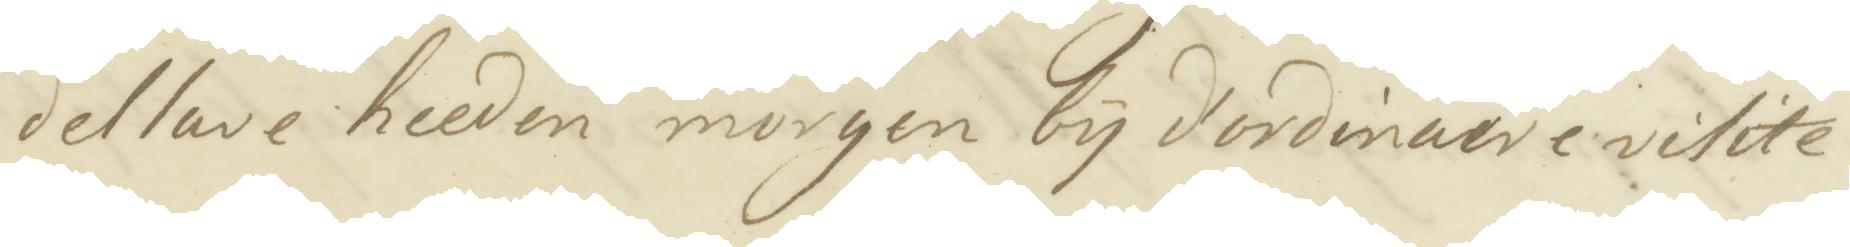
dessave heeden morgen bij d'ordinaire visite
